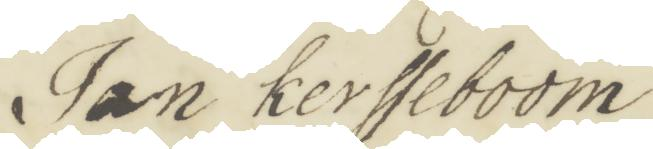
Ian kersseboom
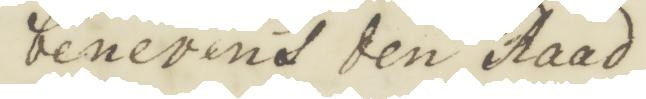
benevens den Raad
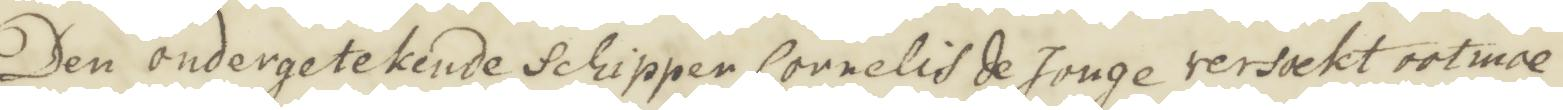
Den ondergetekende schipper Cornelis de Jonge versoekt ootmoe
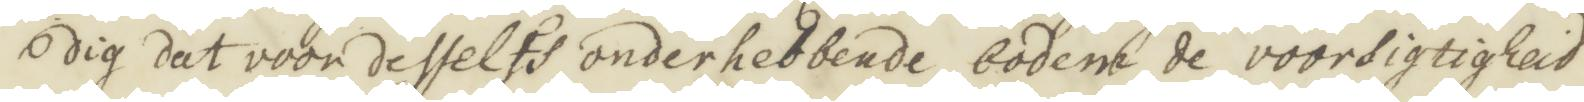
dig dat voor desselfs onder hebbende bodem de voorsigtigheid
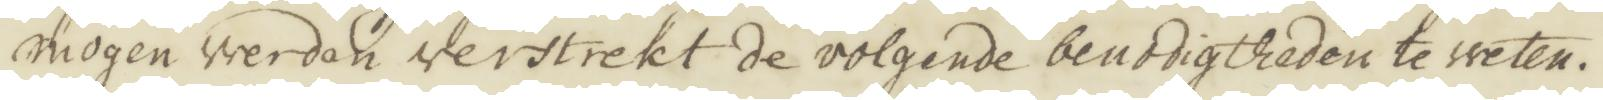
mogen werden verstrekt de volgende benodigtheden te weten.
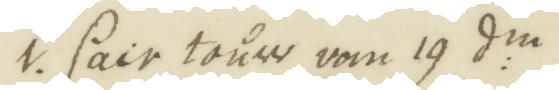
1. Cair touw van 19 d:m
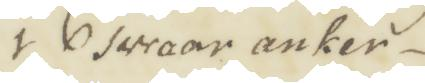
1 swaar anker
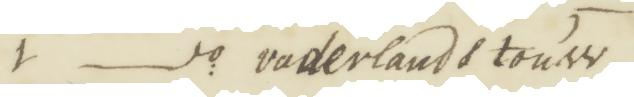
1 —„o vaderlands touw
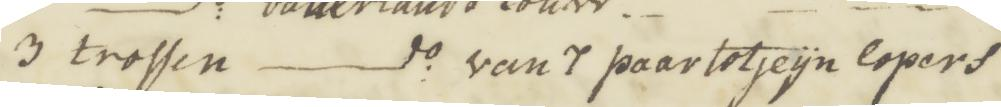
3 trossen —„o van 7 paar totjeijn lopers
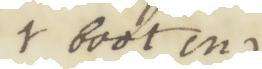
1 boot en}
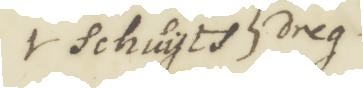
1 schuijts} dreg
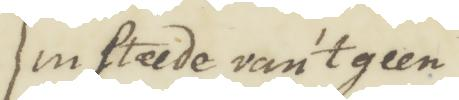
} in steede van ’t geen
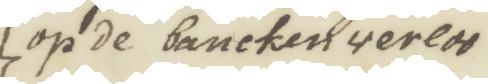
} op de bancken verloo
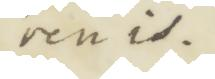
} ren is.
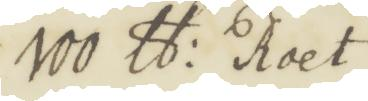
100 lb: Roet
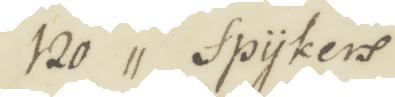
120 „ Spijkers
